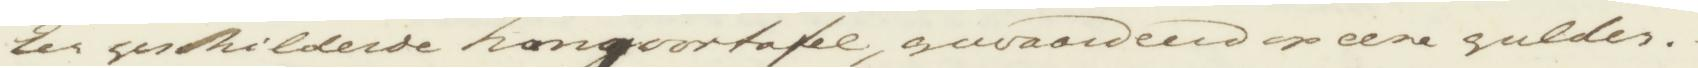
Een geschilderde hangoortafel, gewaardeerd op eene gulden.
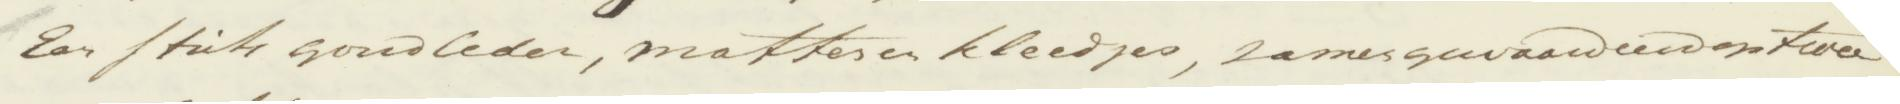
Een stuk goudleder, matten en kleedjes, zamen gewaardeerd op twee
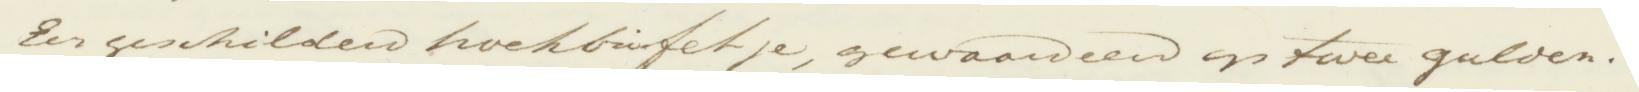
Een geschilderd hoekbufetje, gewaardeerd op twee gulden.
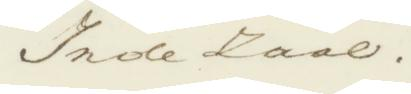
In de Zaal.
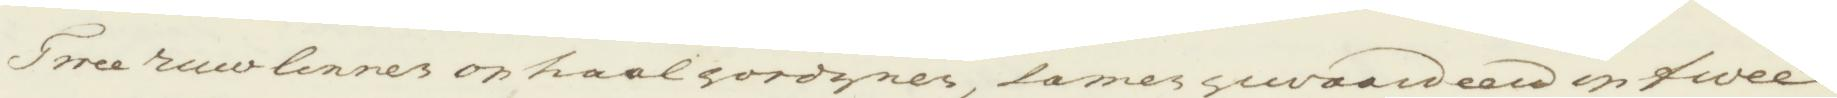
Twee ruwlinnen op haal gordynen, zamen gewaardeerd op twee
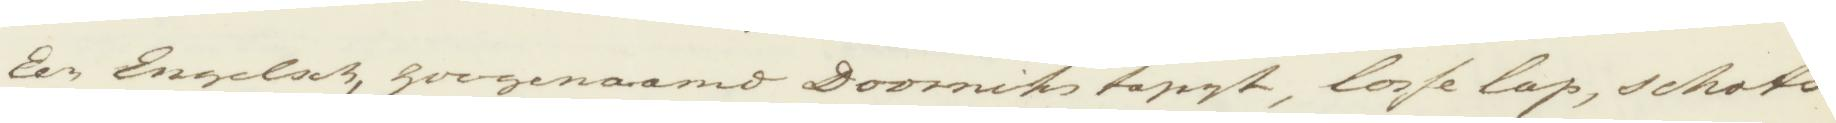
Een Engelsch, zoogenaamd Doorniks tapyt, losse lap, schots
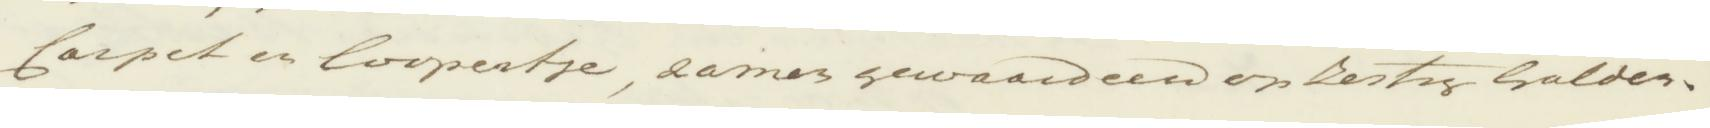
Carpet en loopertje, zamen gewaardeerd op zestig Gulden.
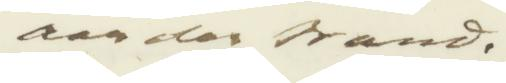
aan den Wand.
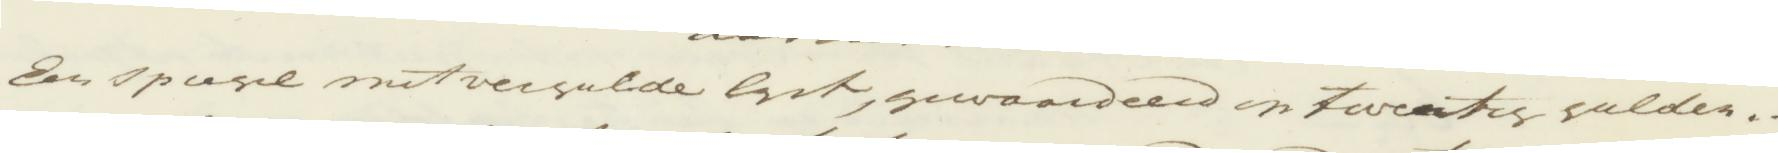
Een spiegel met vergulde lyst, gewaardeerd op twintig gulden.
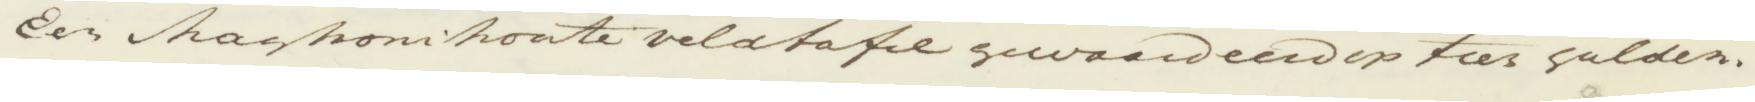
Een Maghonihoute veldtafel gewaardeerd op tien gulden.
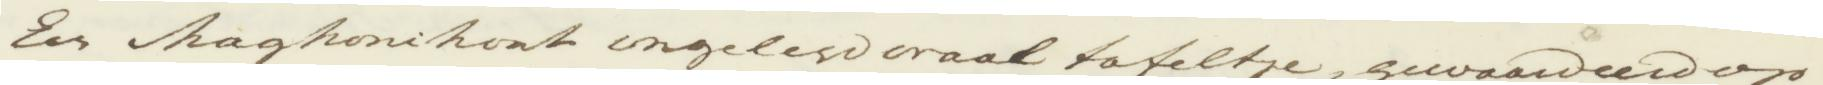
Een Maghonihout ingelegd ovaal tafeltje, gewaardeerd op
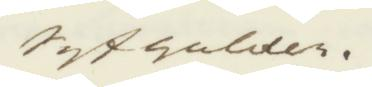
vyf gulden.
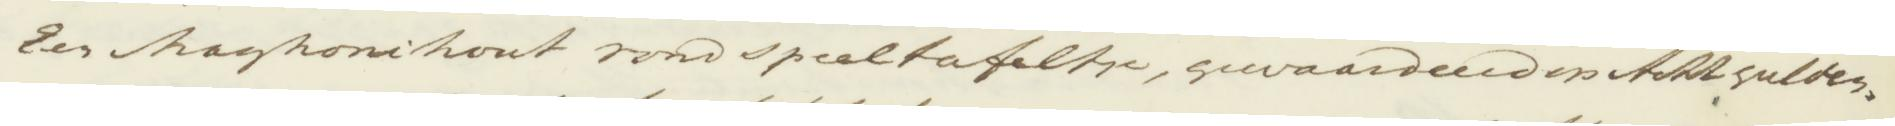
Een Maghonihout rond speeltafeltje, gewaardeerd op Acht gulden,
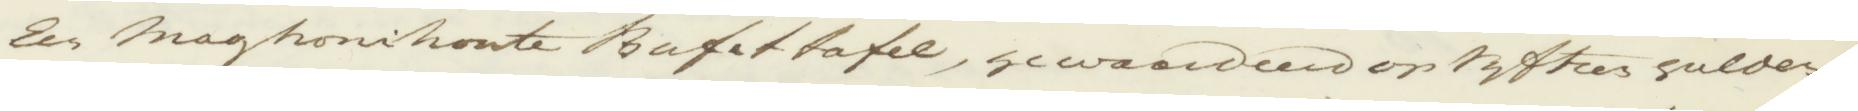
Een maghonihoute Bufettafel, gewaardeerd op Vyftien gulden.
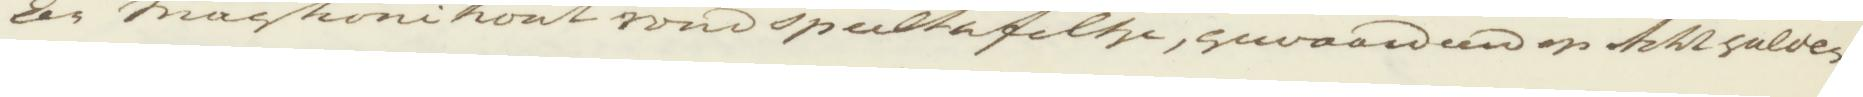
Een maghonihout rond speeltafeltje, gewaardeerd op Acht gulden,
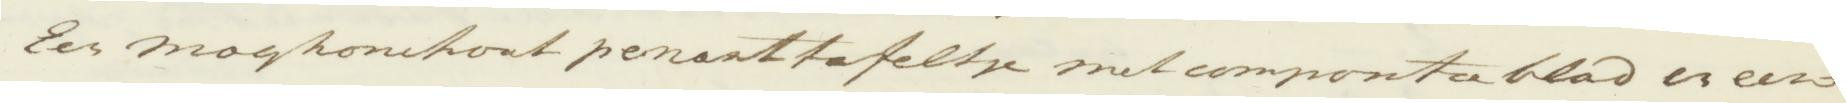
Een maghonihout penant tafeltje met compositen blad en een
